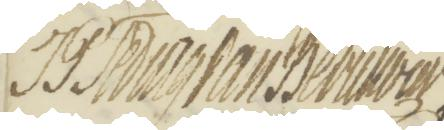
JP Teding van Berkhout
